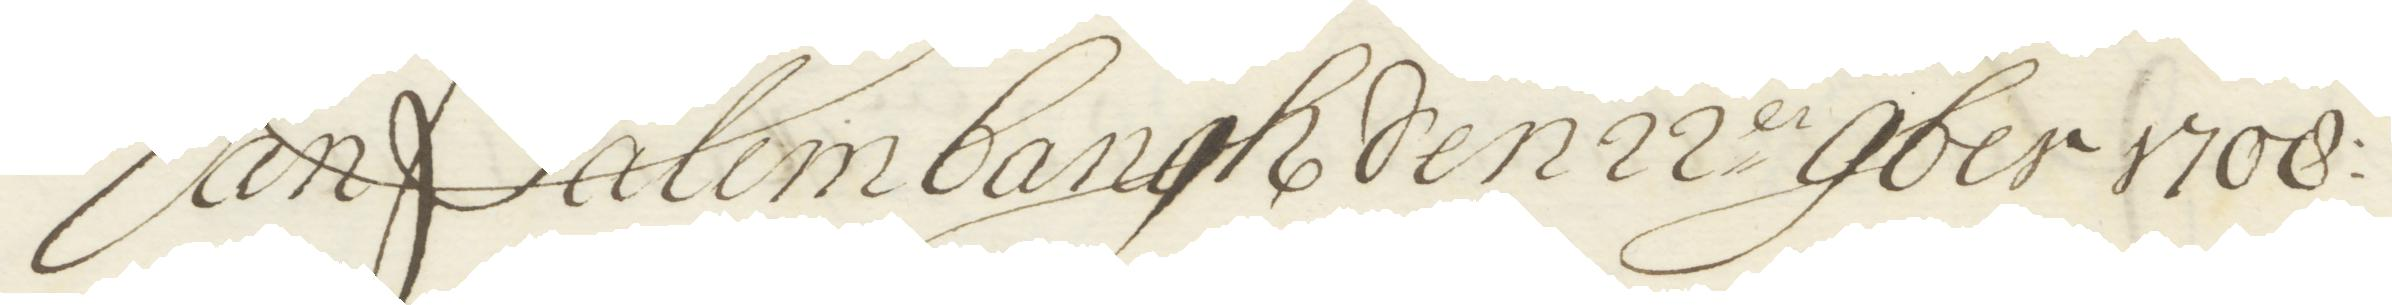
Van Salembangh den 22„en 9ber 1708:
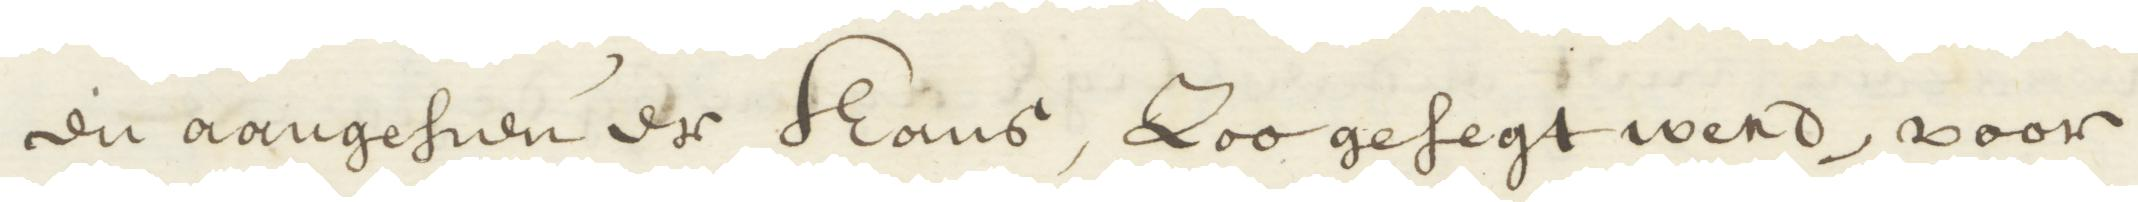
en aangesien er thans, zoo gesegt werd, voor
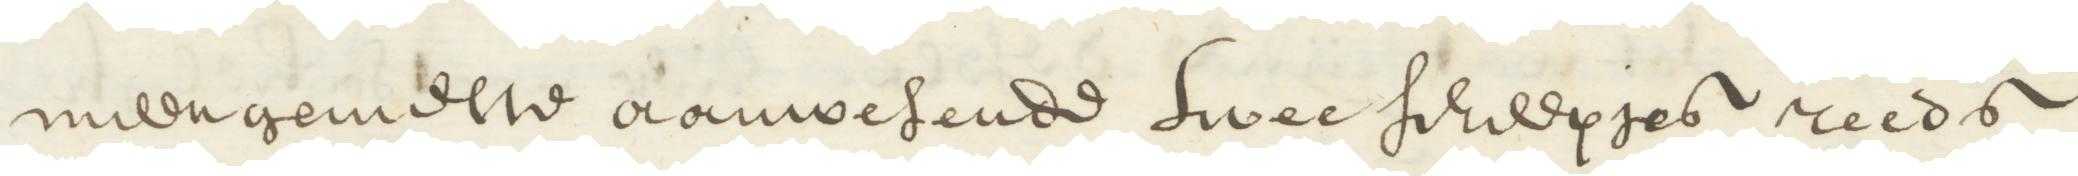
meer gemelte aanwesende twee scheepjes reeds
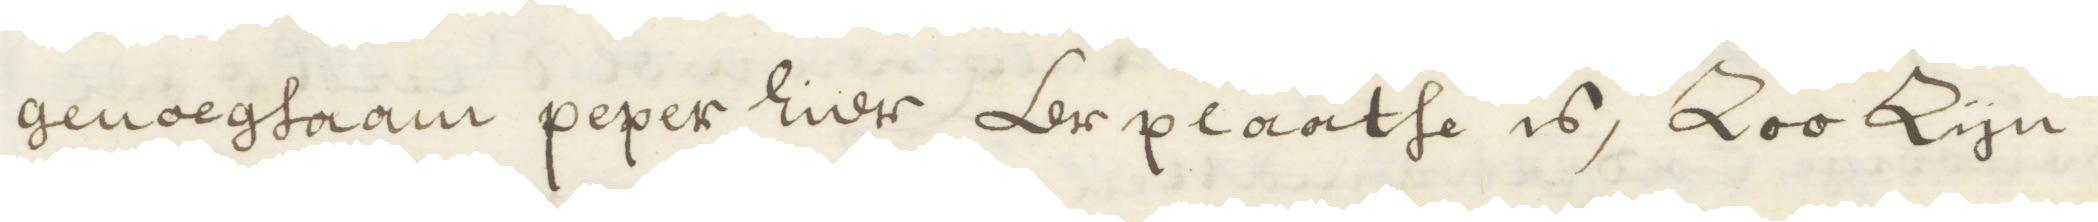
genoegsaam peper hier ter plaatse is, zoo zijn
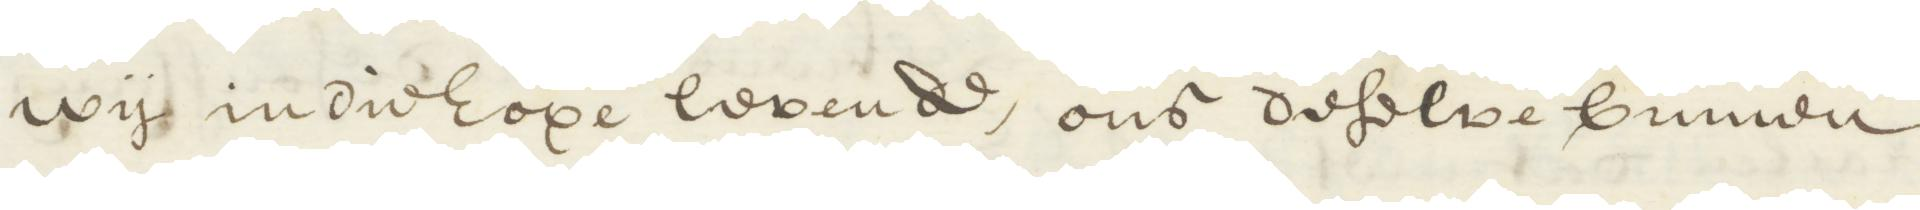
wij in diehope levende, ons deselve binnen
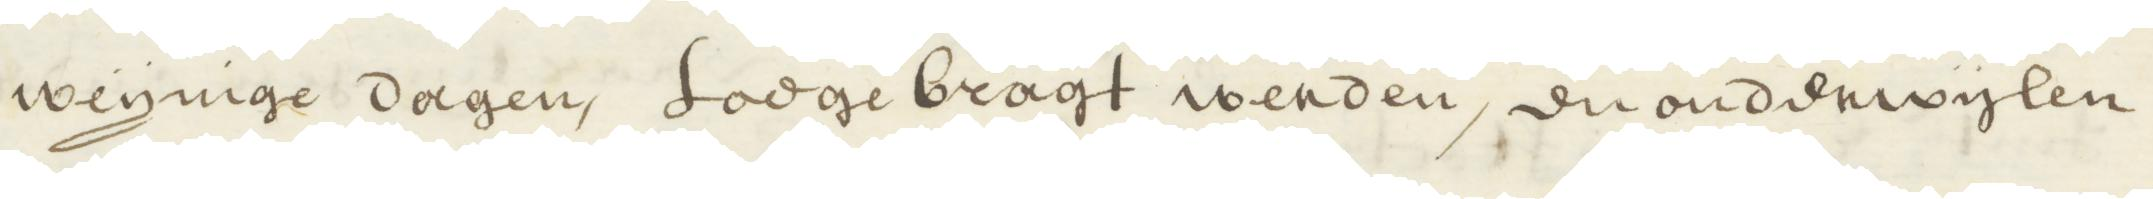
weijnige dagen, toegebragt werden, en onderwijlen
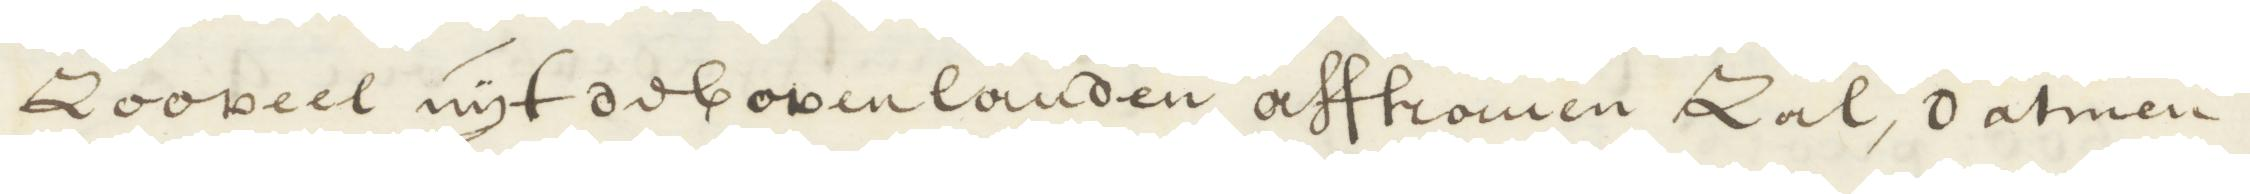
zooveel uijt debovenlanden affkomen zal, datmen
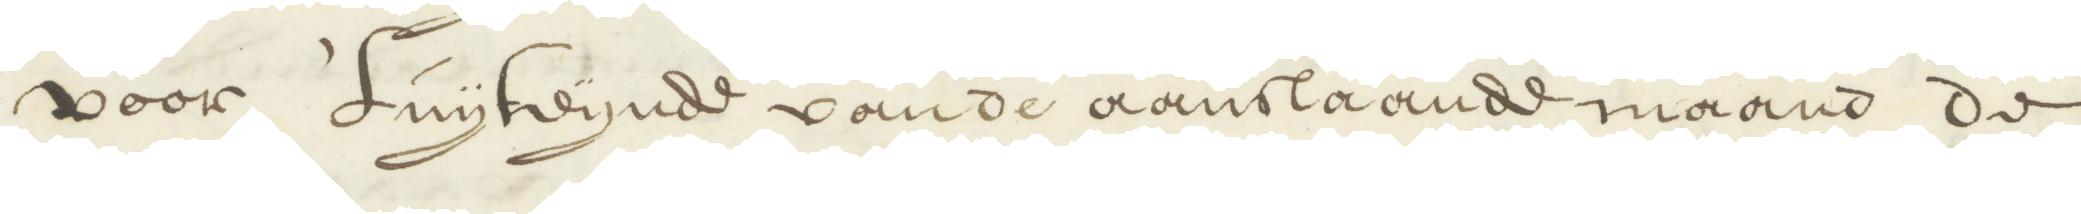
voor 't uijteijnde vande aanstaande maand de
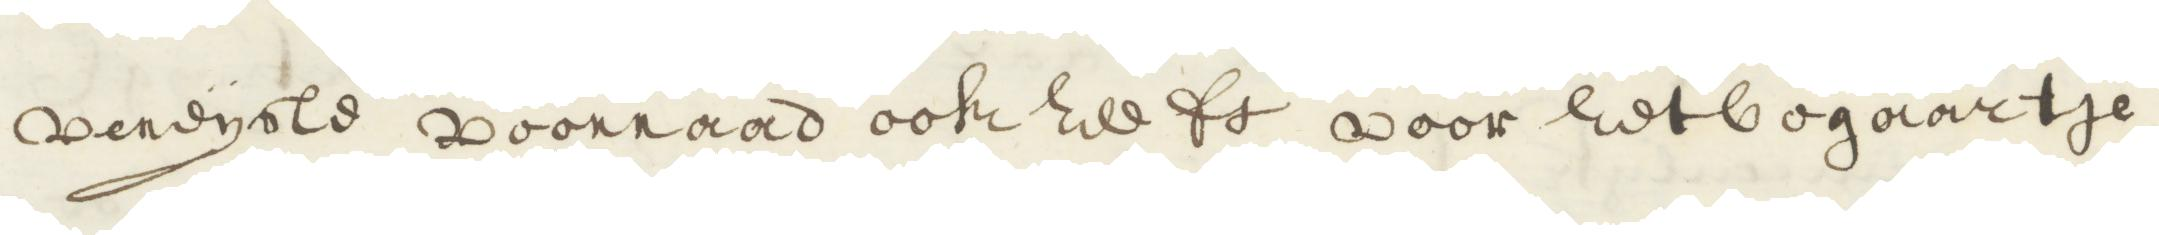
vereijste voorraad ook heeft voor het bogaartje
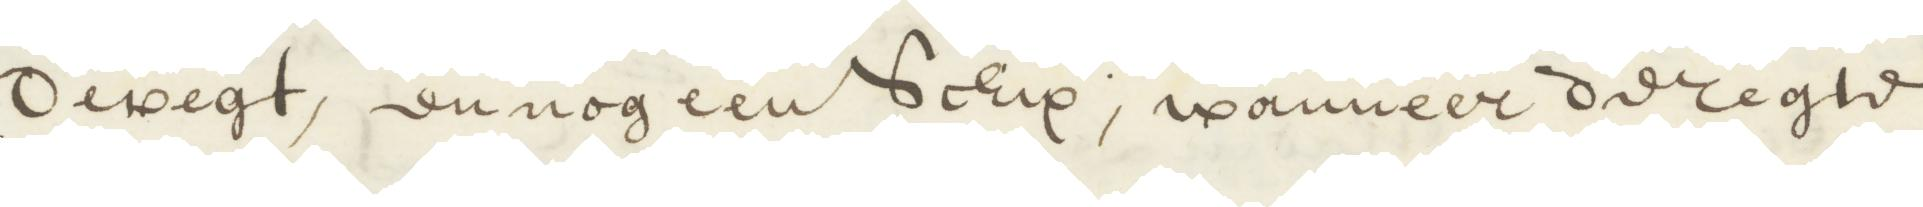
devegt, en nog een schip; wanneer deregte
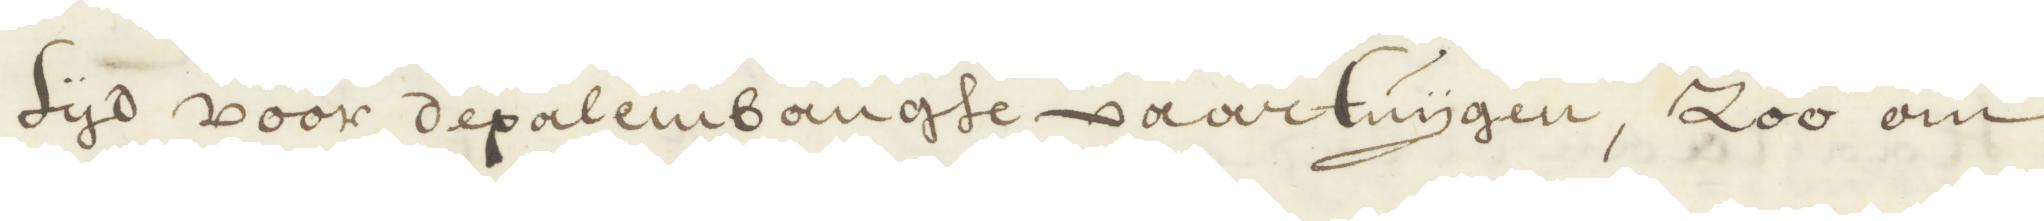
tijd voor depalembangse vaartuijgen, zoo om
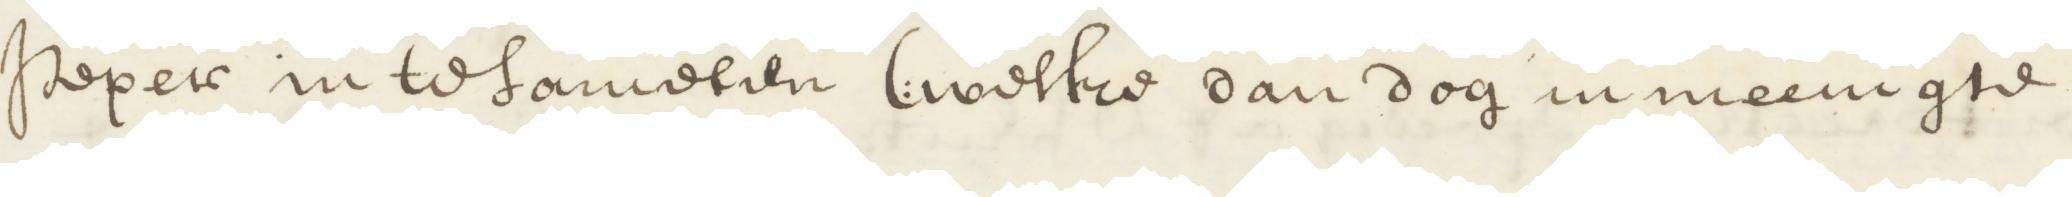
Peper in te samelen (:welke dan dog in meenigte
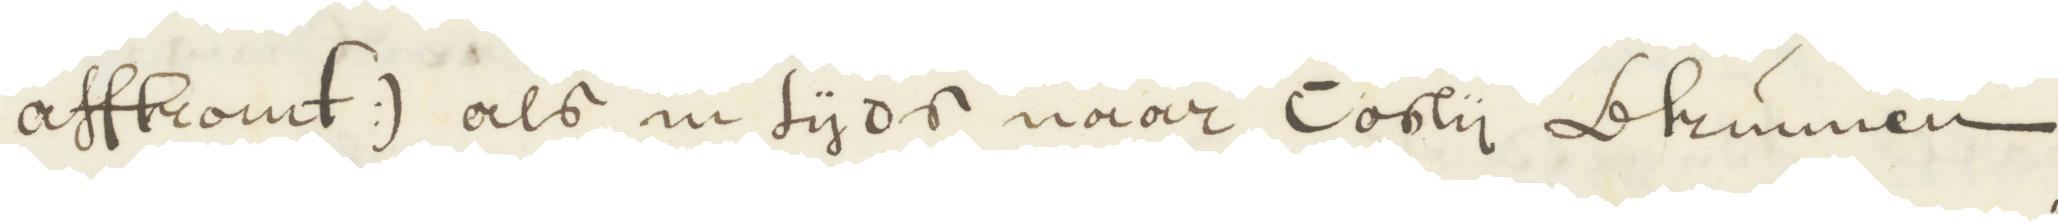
affkomt:) als in tijds naar Costij tekunnen
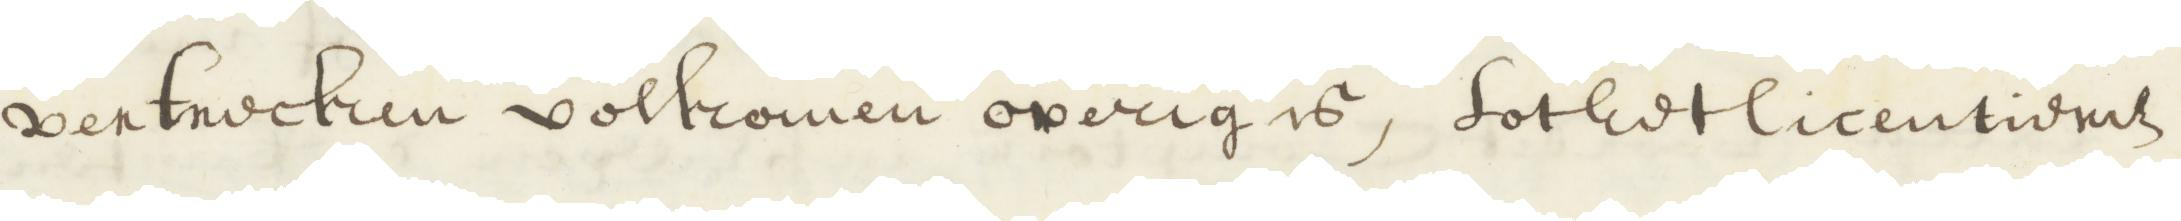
vertrecken volkomen overig is, tothetlicentiëren
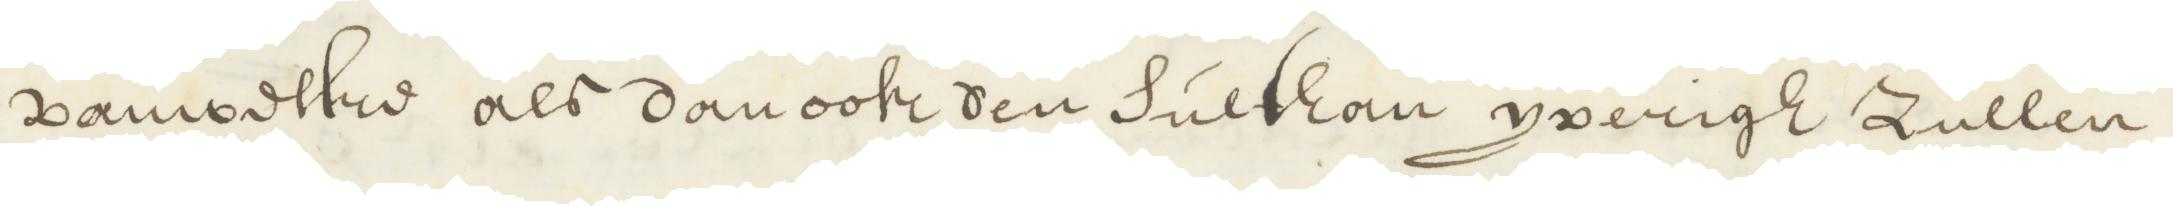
vanwelke als dan ook den sulthan ijverigh zullen
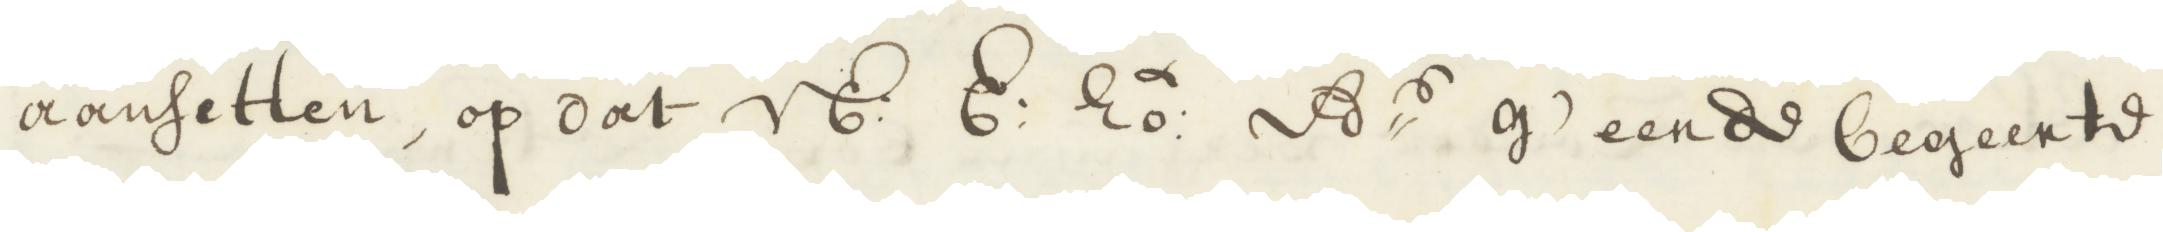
aansetten, op dat VE: E: ho:t Ed„s g’eerde begeerte
